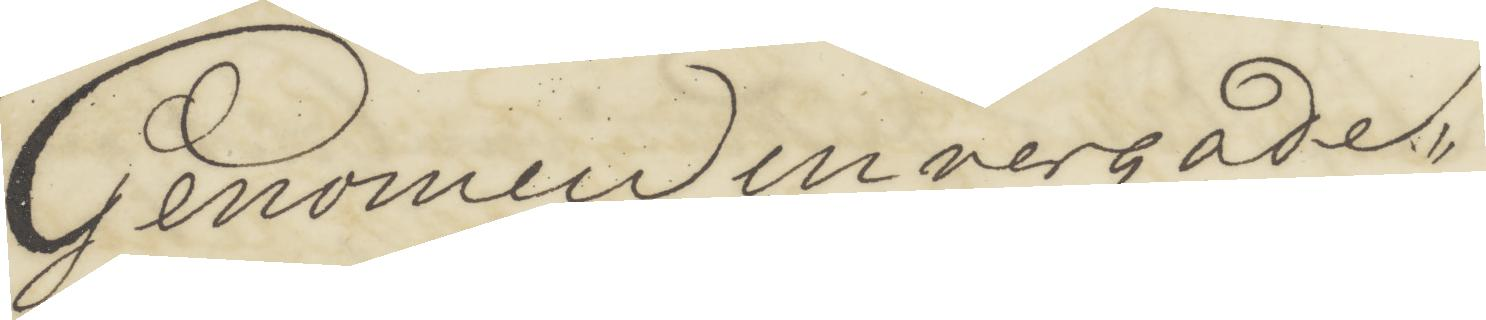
Genomen in vergade„
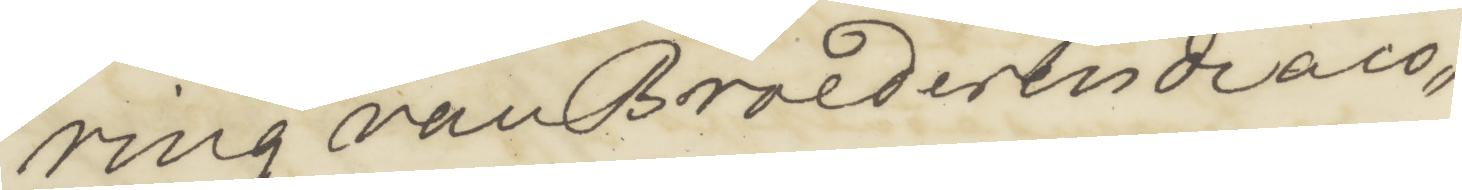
ring vanBroederen diaco„
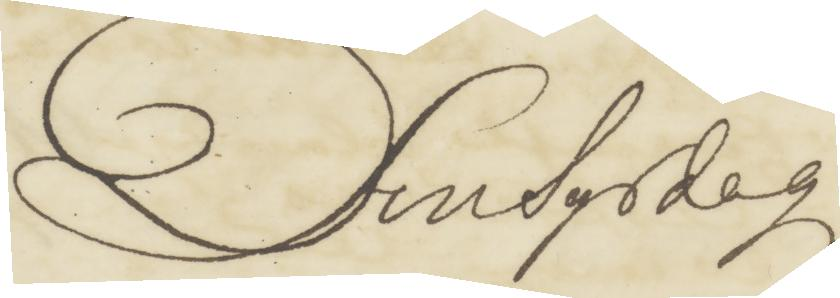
Dinsgsdag
